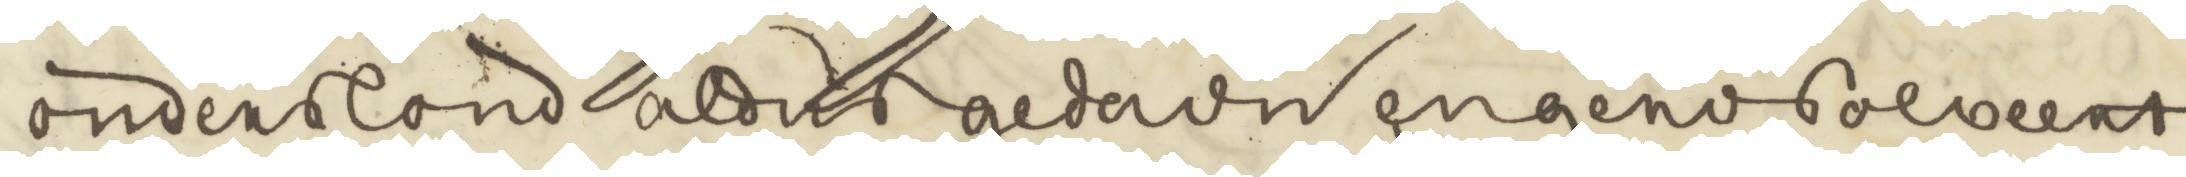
onderstond aldus gedaen en geresolveert
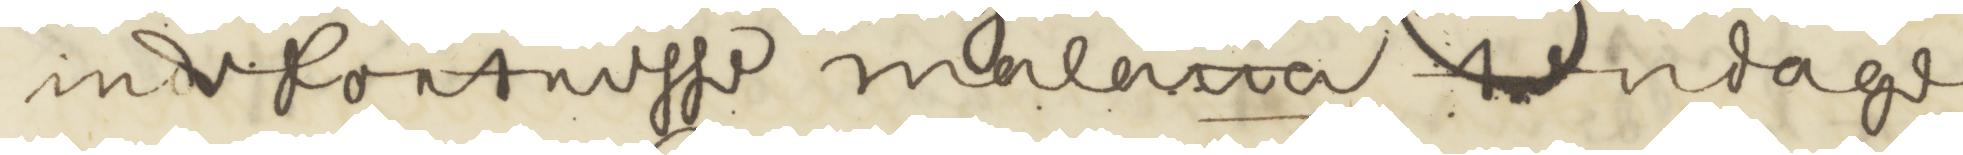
in de fortresse malacca tendage
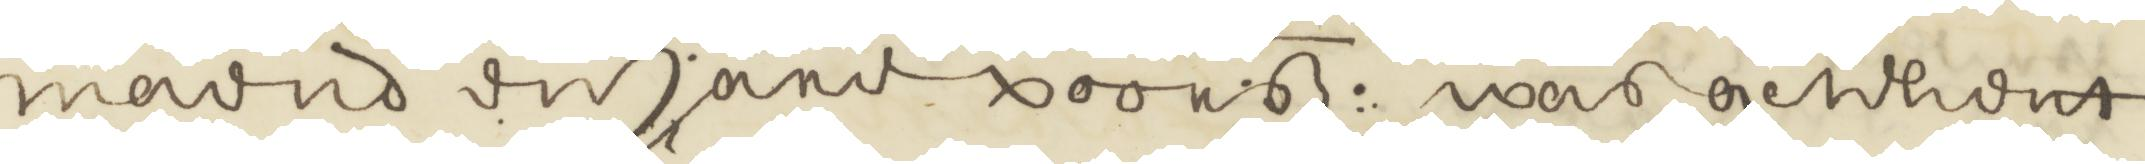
maend enJare voors: was getekent
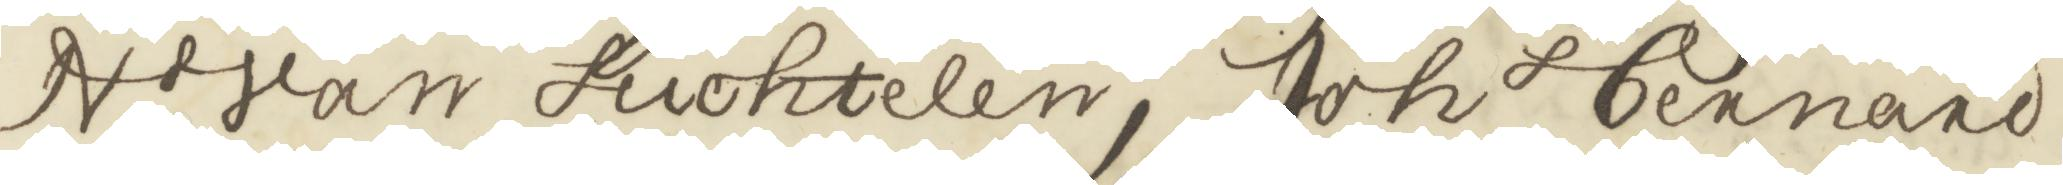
H:s van Suchtelen, Joh:s bernard
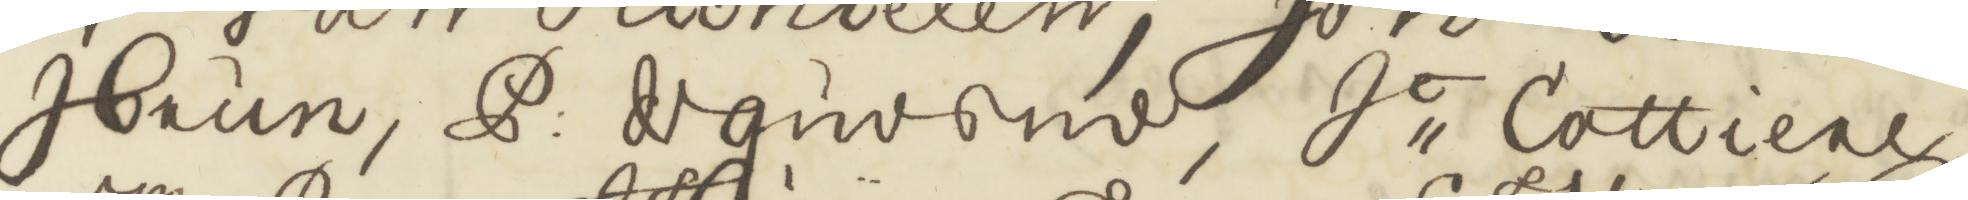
Jbrun, P: de quesne, I„c Cottiere
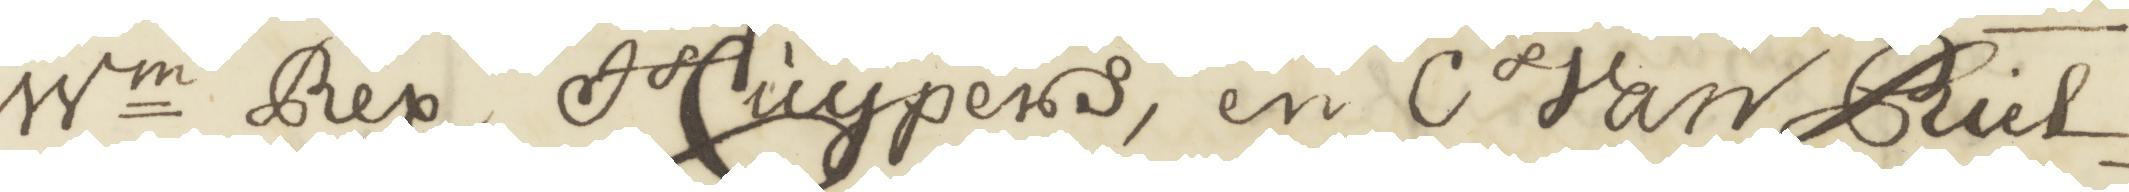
W=m Rex, I:s Cuijpers, en C:s s van Riel
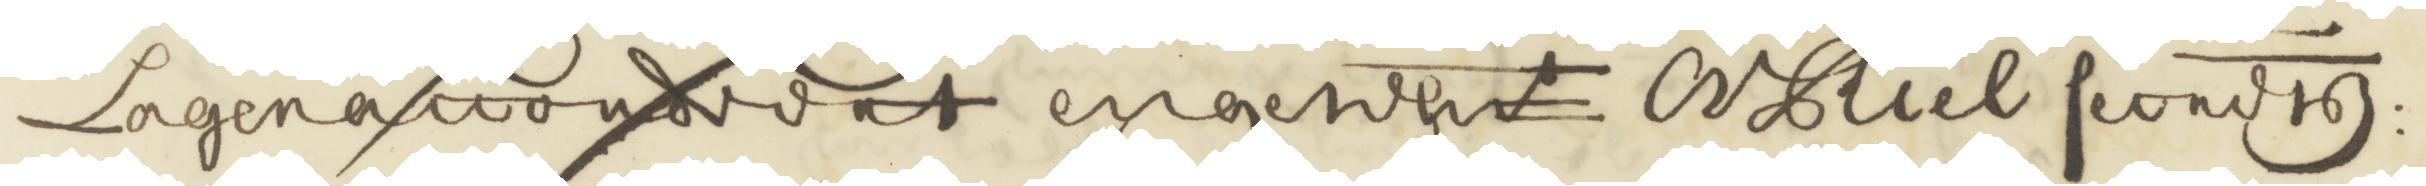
Lager accordeert engetek=t CV Riel secrets:
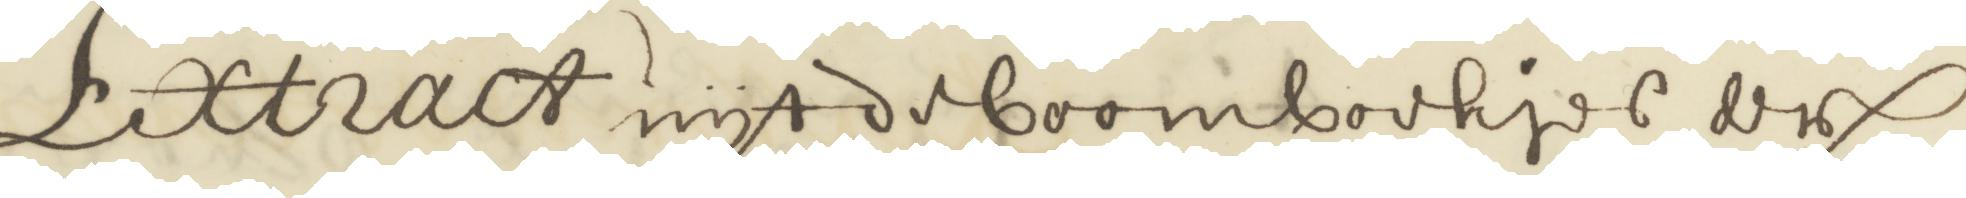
Extract uijt de boom boekjes der
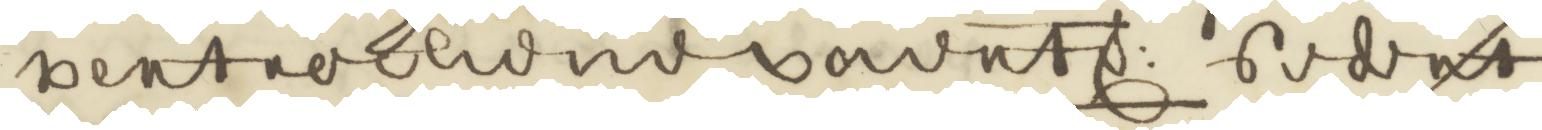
vertrockene vaert vert: sedert
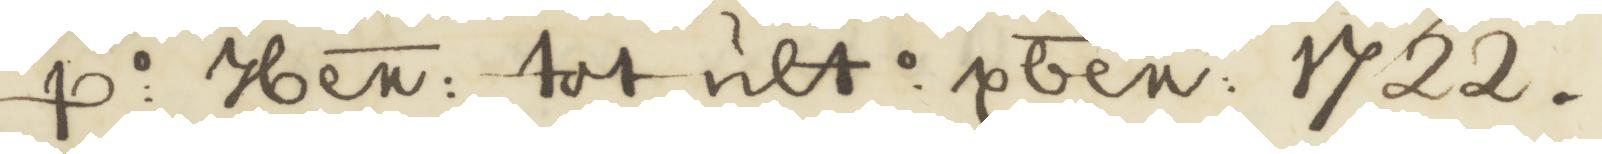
p:o 7ber: tot ult.o xber: 1722.
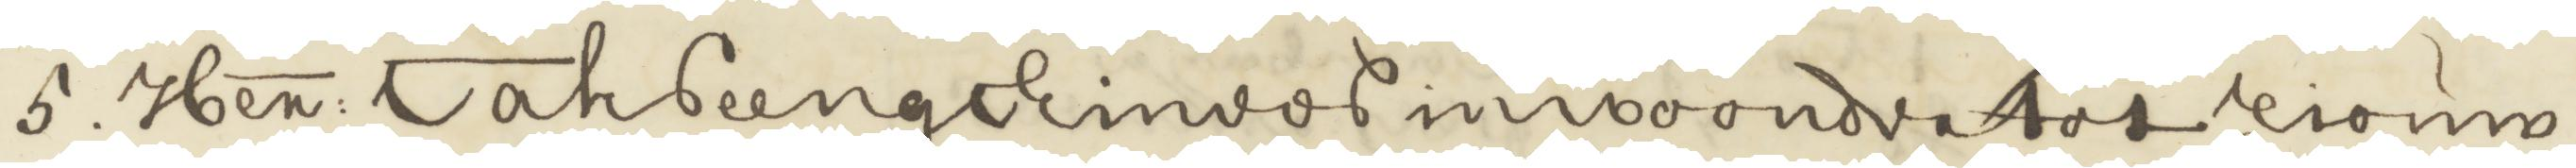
5. 7ber: Cakseeng chinees inwoonder tot riouw
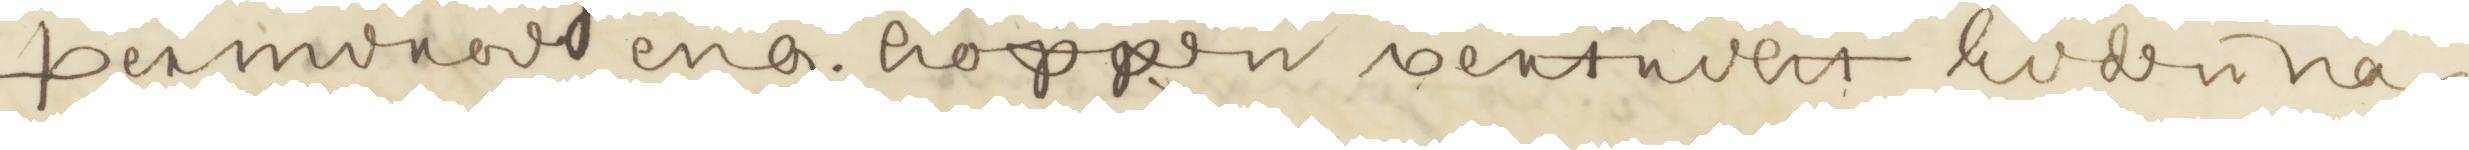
per meroe en 9. koppen vertrekt heden na
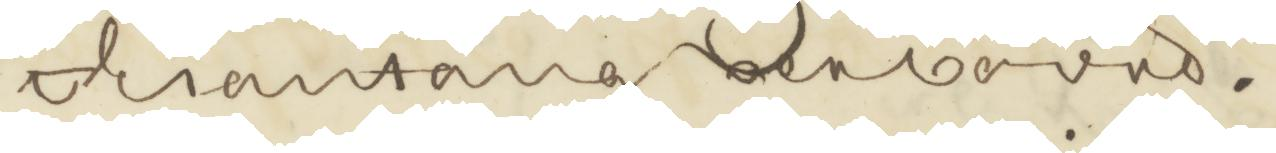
chiantang vervoerd.
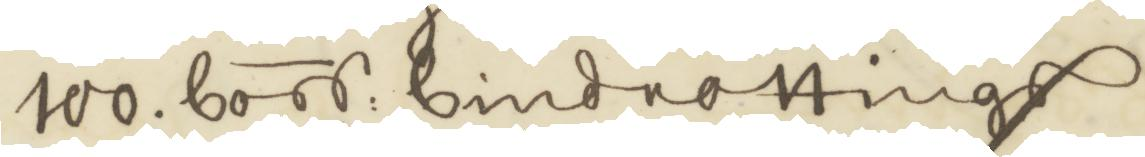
100. boss: bindrottings
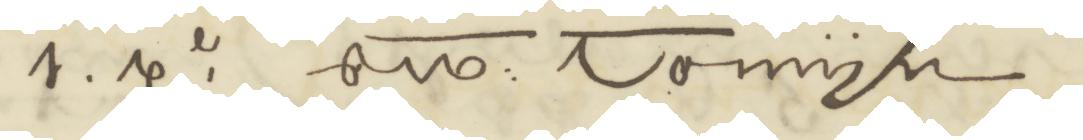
1. p„l sw: Comijn
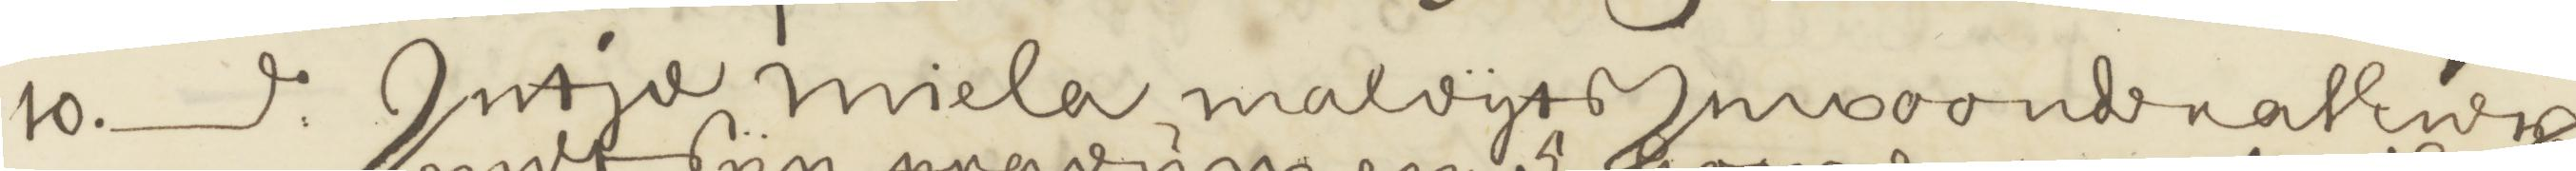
10. D:o Intje miela maleijts Inwoonder alhier
